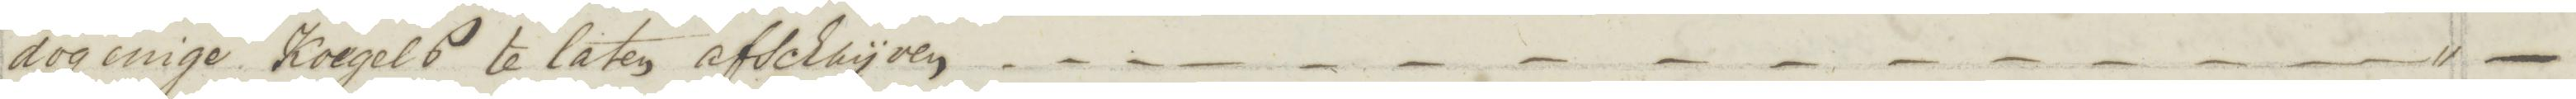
dog enige Koegels te laten afschrijven - – – — — — — — — — — — — — „ —
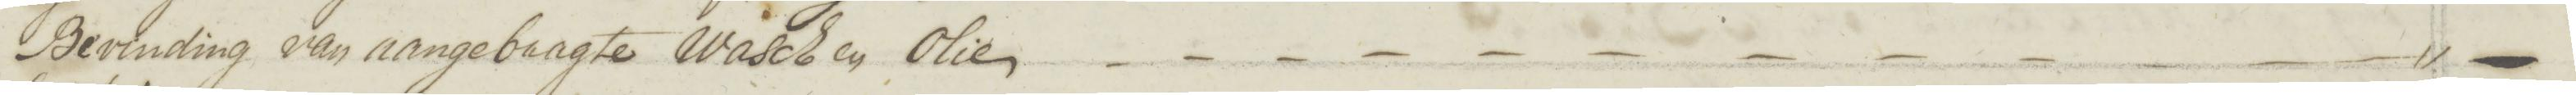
Bevinding van aangebragte wasch en Olie – – – — — — — — — — „ —
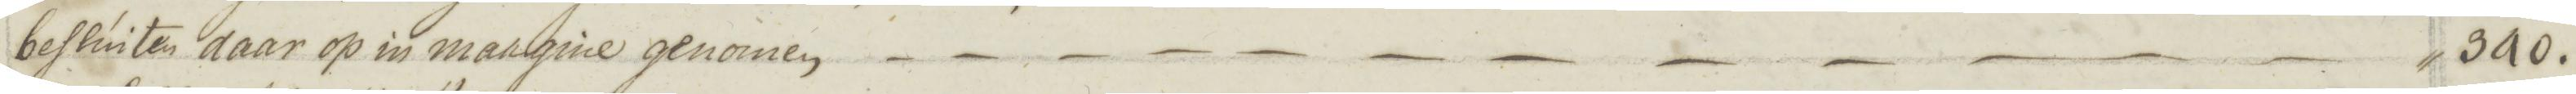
besluiten daar op in margine genomen — — — — — — — — — — — — „ 340.
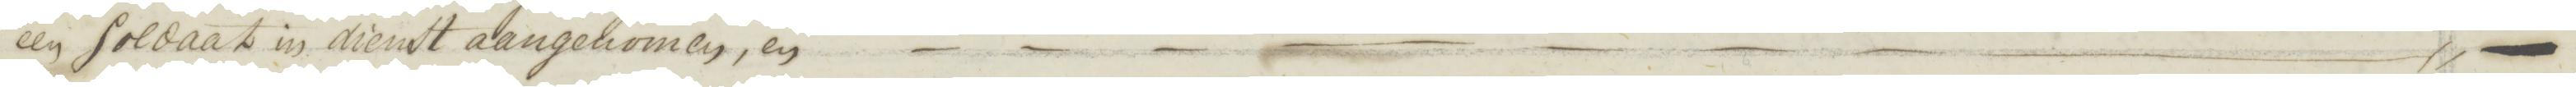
een soldaat in dienst aangenomen, en — — — — — — — — „ —
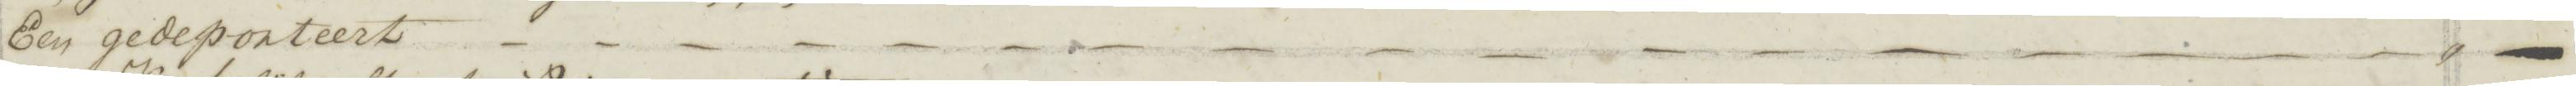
Een gedeporteert — — — — — — — — — — — — — — — — — „ —
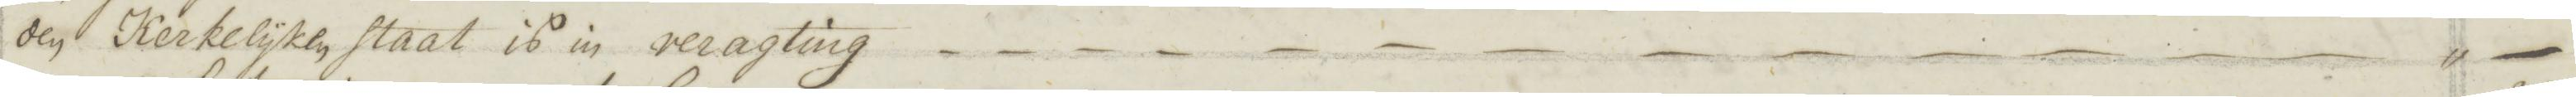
den Kerkelijken staat is in veragting – — — — — — — — — — — — — „ —
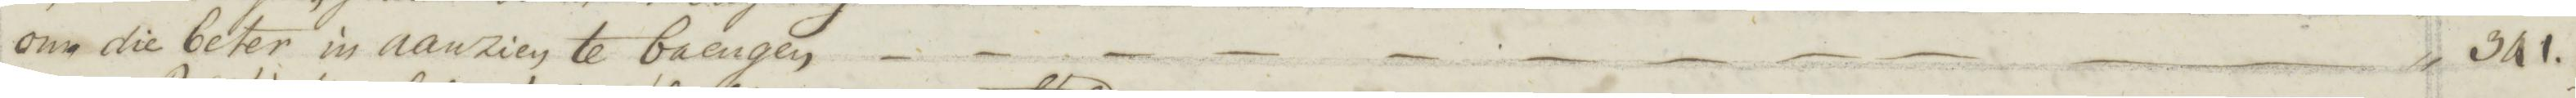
om die beter in aanzien te brengen — — — — — — — — — — — „ 341.
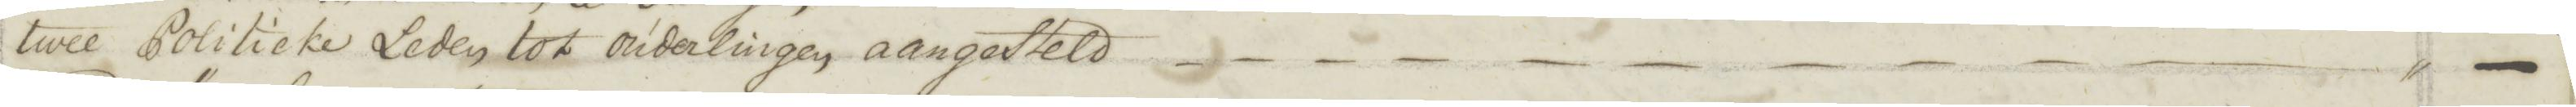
twee Politieke Leden tot ouderlingen aangesteld — — — — — — — — — — „ —
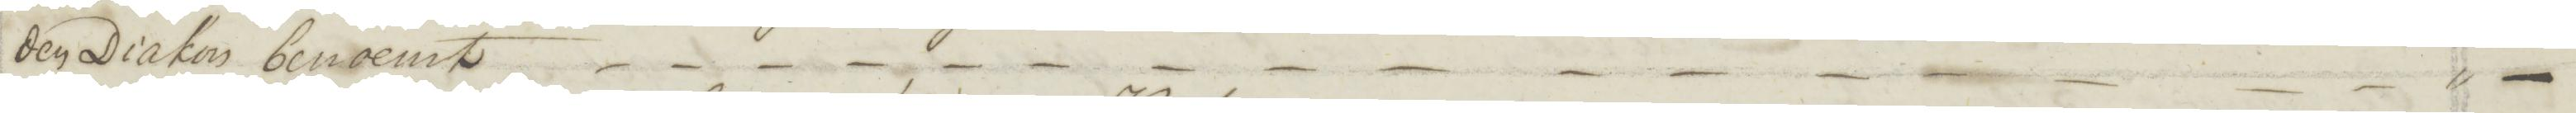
den Diaken benoemt — — — — — — — — — — — — — — — — „ —
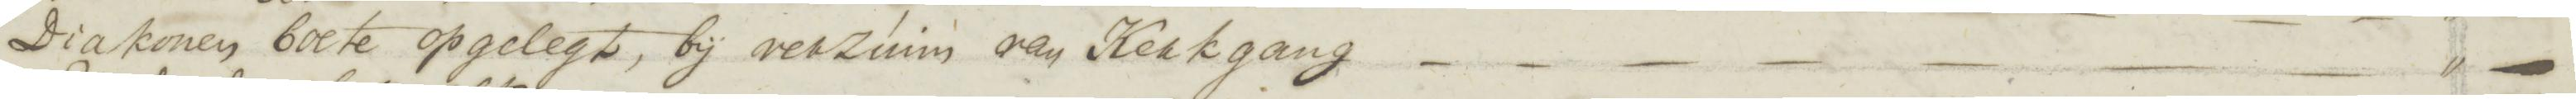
Diakonen boete opgelegt, bij verzuim van Kerkgang — — — — — — — „ —
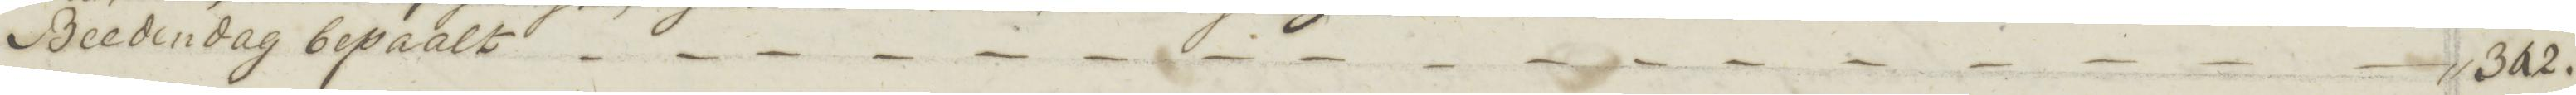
Beedendag bepaalt – — — — — — — — — — — — — — — — —„ 342
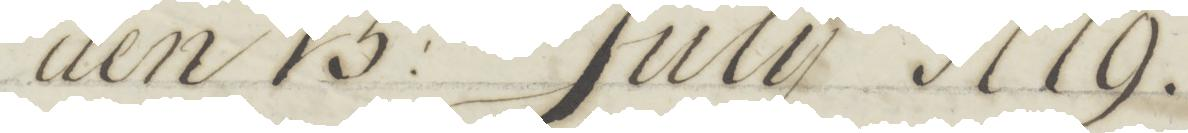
den 15: Julij 1779.
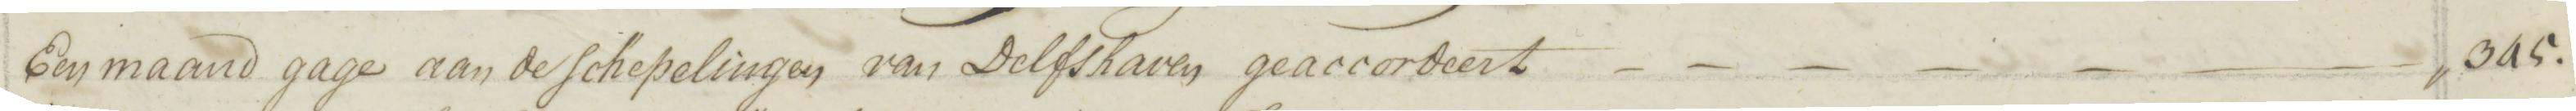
Een maand gage aan de schepelingen van Delfshaven geaccordeert — — — — — — „ 345.
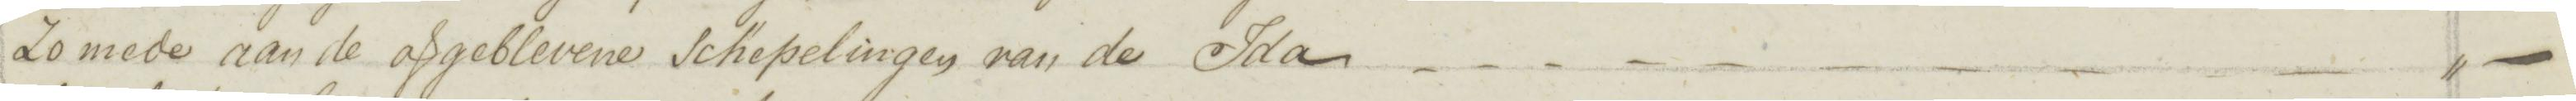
zo mede aan de overgeblevene schepelingen van de Ida – – – – — — — — — „ —
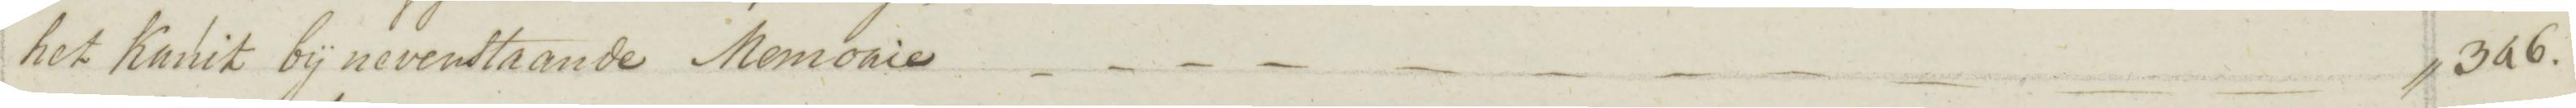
het kauit bij nevenstaande Memorie — — — — — — — — — — — „ 346.
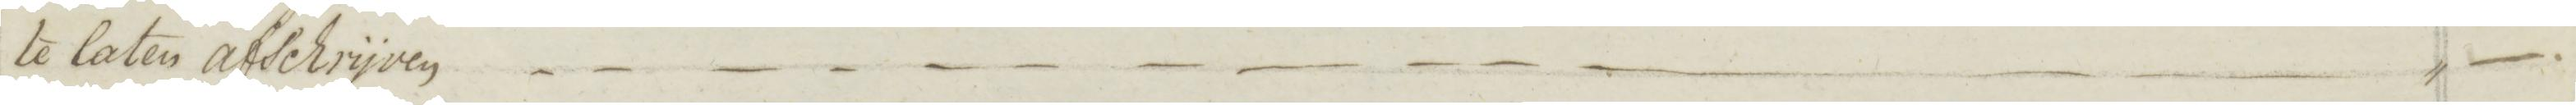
te laten afschrijven – — — – — — — — — — — — — — „ — .
